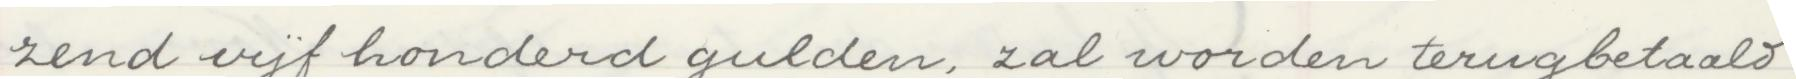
zend vijf honderd gulden, zal worden terugbetaald
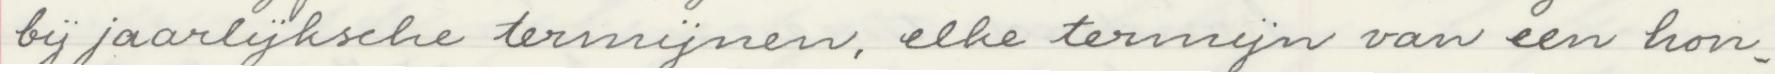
bij jaarlijksche termijnen, elke termijn van een hon-
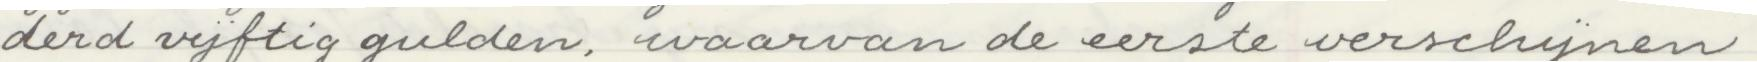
derd vijftig gulden, waarvan de eerste verschijnen
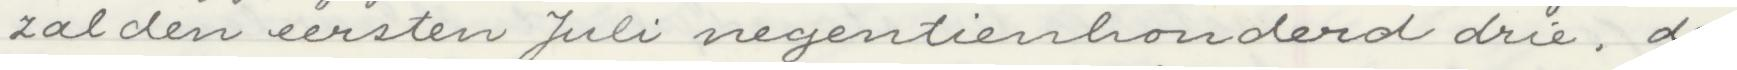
zal den eersten Juli negentienhonderd drie, de
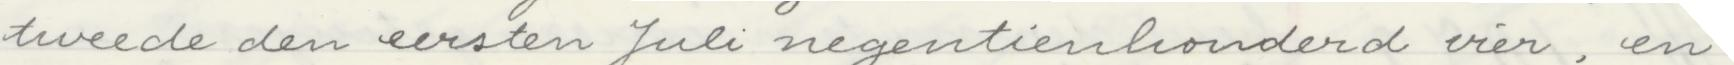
tweede den eersten Juli negentienhonderd vier, en
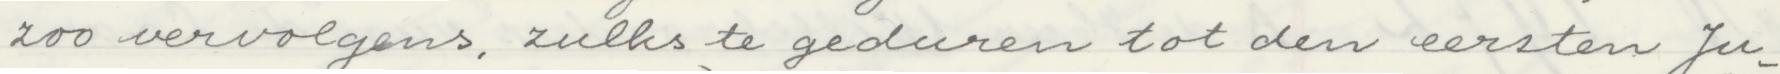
zoo vervolgens, zulks te geduren tot den eersten Ju-
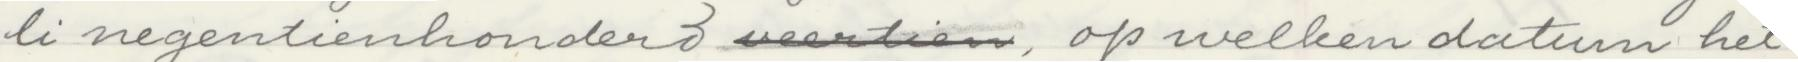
li negentienhonderd veertien, op welken datum het
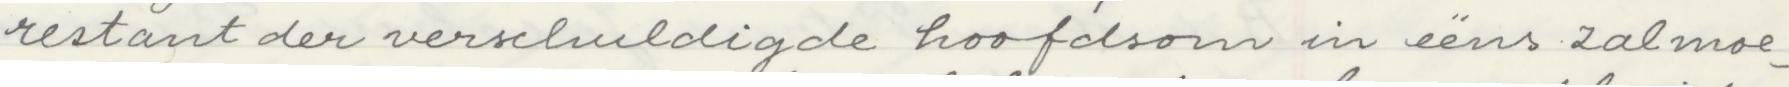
restant der verschuldigde hoofdsom in eens zal moe
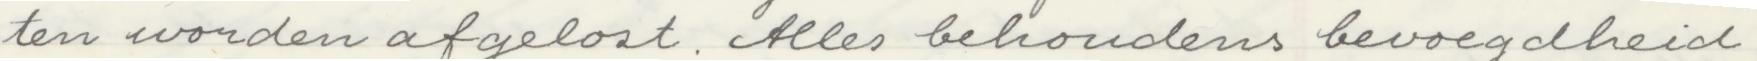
ten worden afgelost. Alles behoudens bevoegdheid
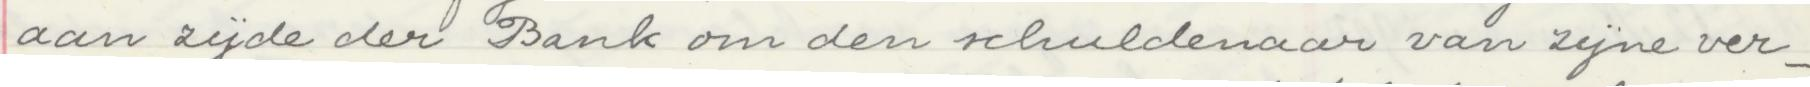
aan zijde der Bank om den schuldenaar van zijne ver
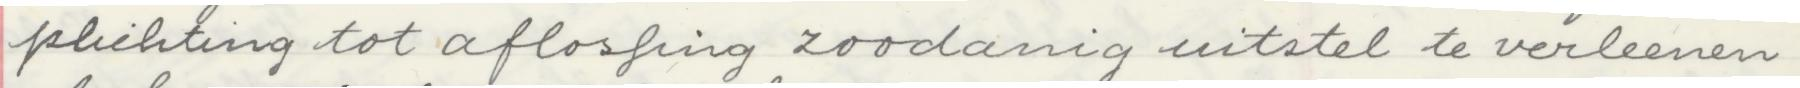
plichting tot aflossing zoodanig uitstel te verleenen
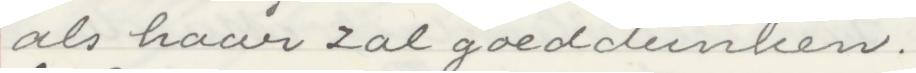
als haar zal goeddunken.
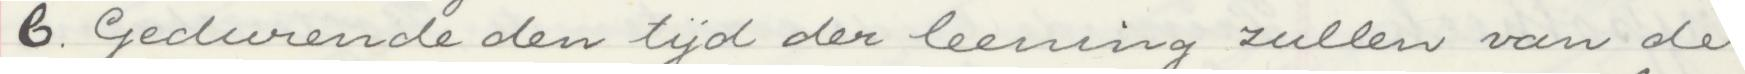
b. Gedurende den tijd der leening zullen van de
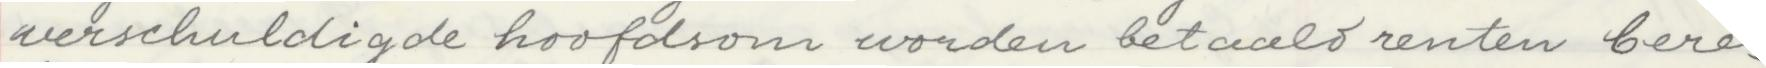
verschuldigde hoofdsom worden betaald renten bere-
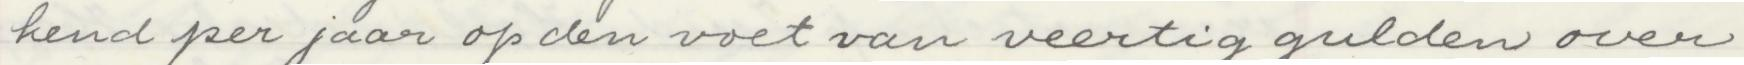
kend per jaar op den voet van veertig gulden over
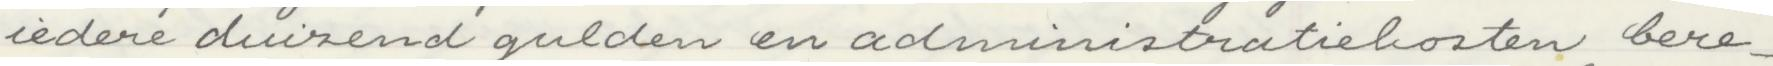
iedere duizend gulden en administratiekosten bere
